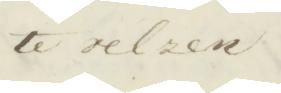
te velzen
